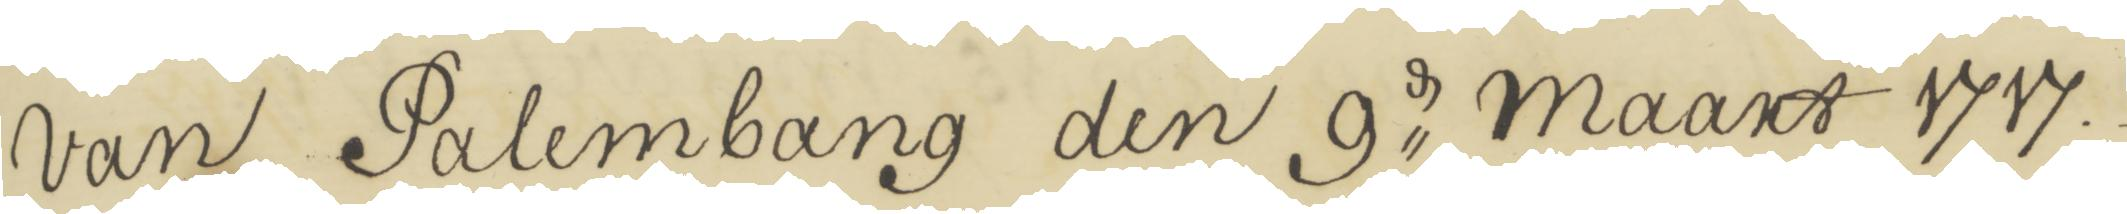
van Palembang den 9„en Maart 1717.
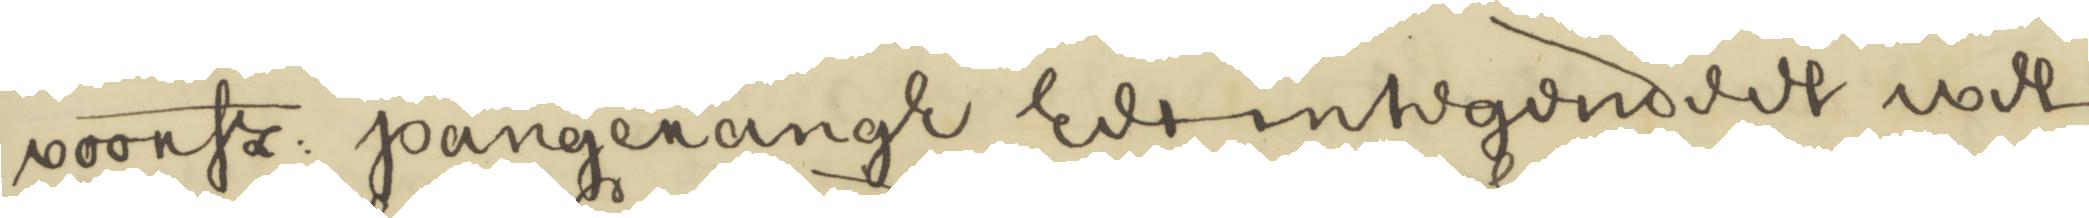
voorsz: pangerangh het integendeel wel
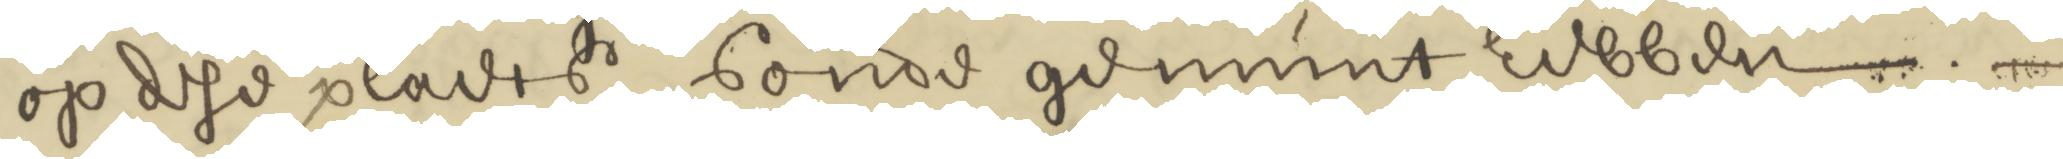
op dese plaets soude gemunt hebben.
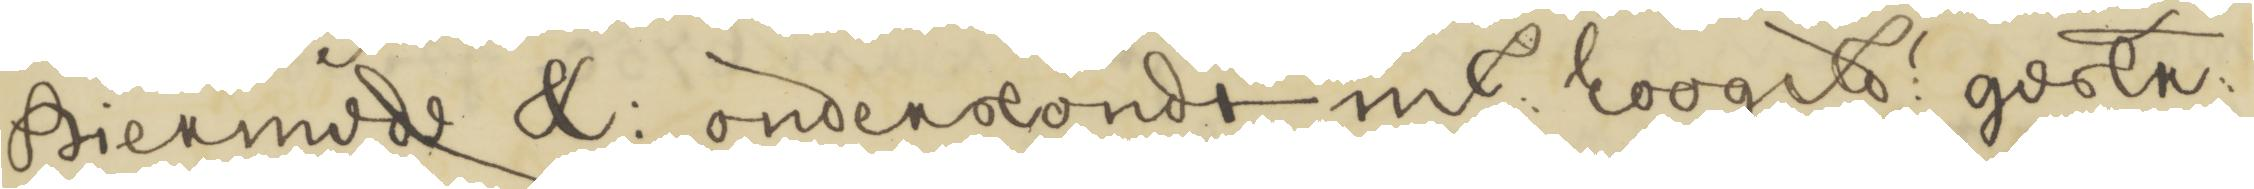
Hiermede &: onderstondt uE: hoog Ed:s gestr:
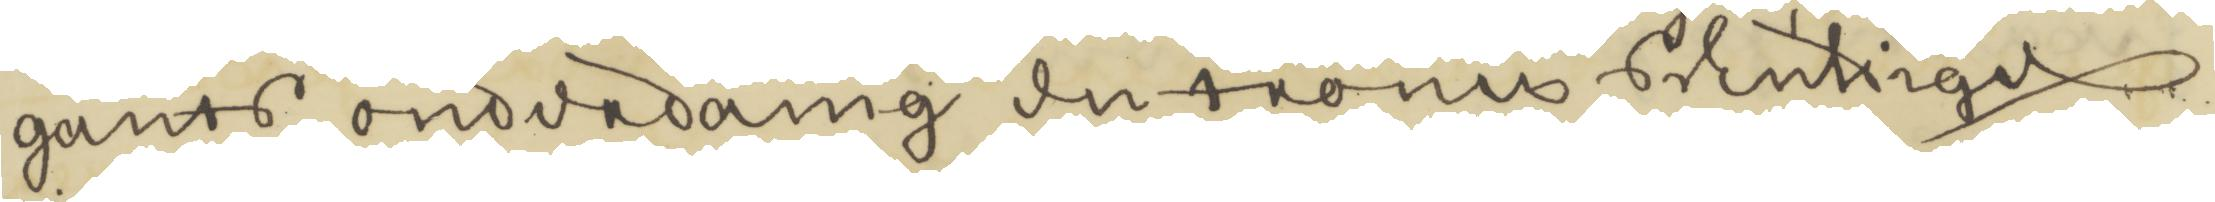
gants onderdanig en trouw schutige
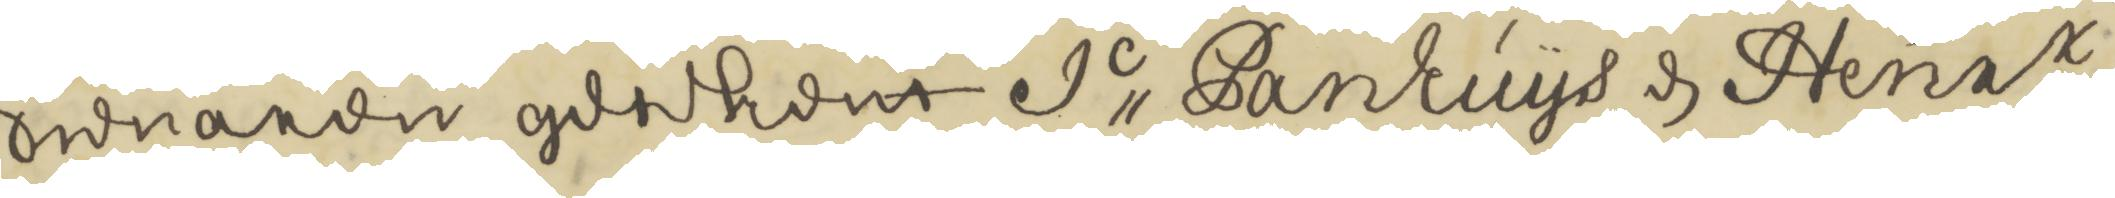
dienaren getekent J„c Panhuijs en Henr=r
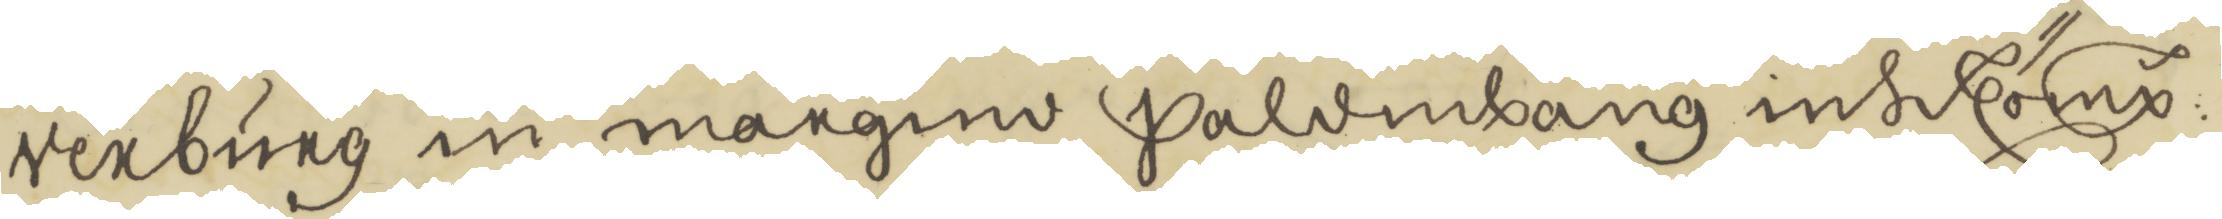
verburg in margine palembang ins EComp:s
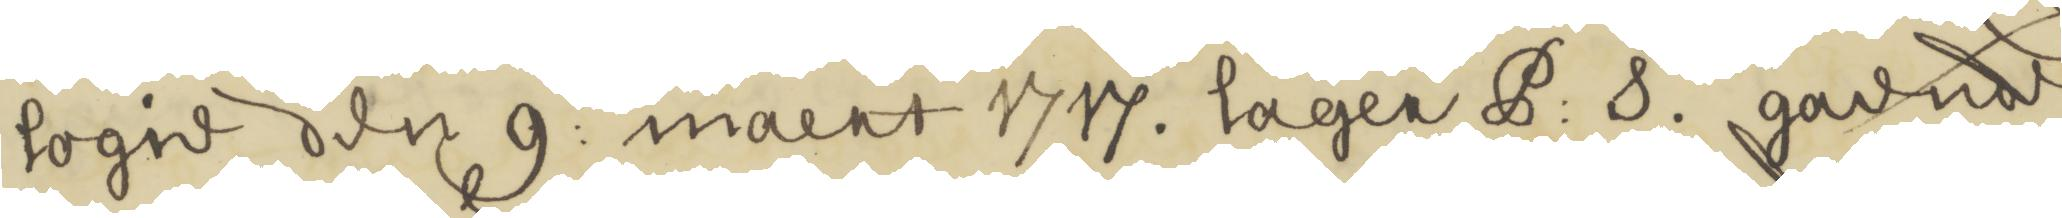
sogie den 9:' maert 1717. lager P: 8. gaende
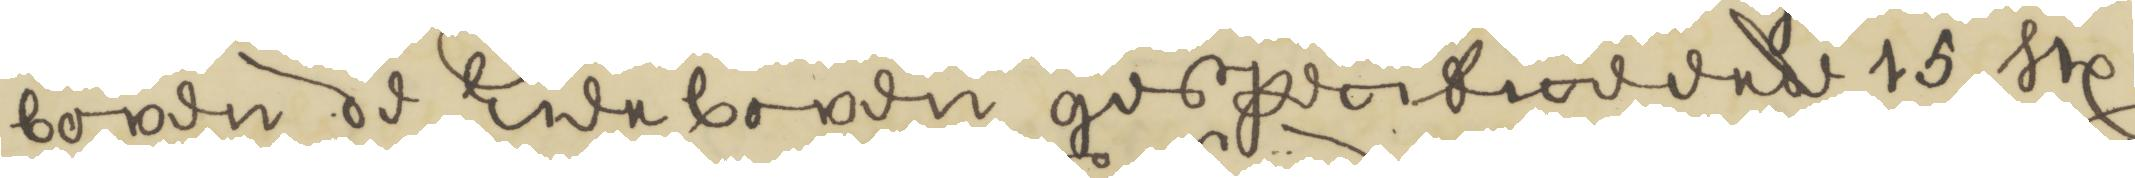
boven de hier boven gespecificeerde 15. stx
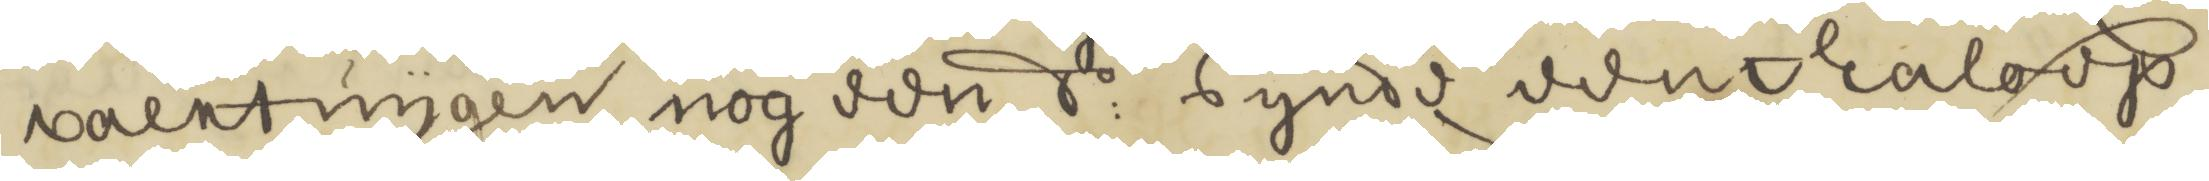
vaertuijgen nog een d:o sijnde een chaloep
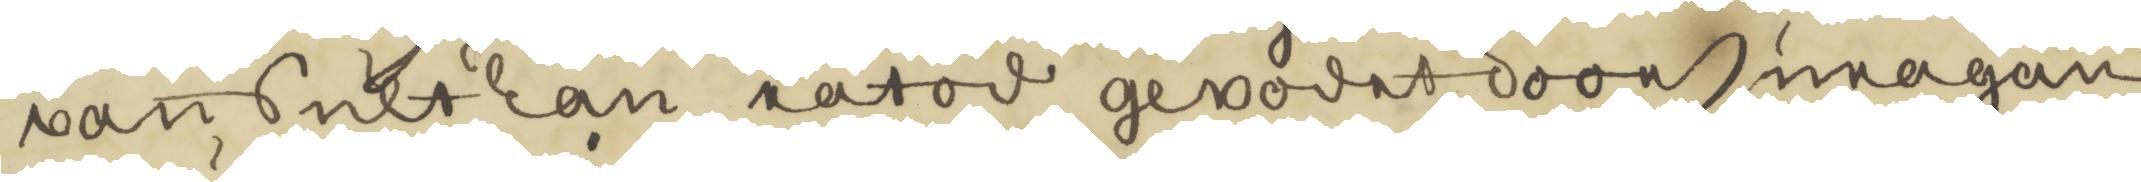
van sulthan ratoe gevoert door Juragan
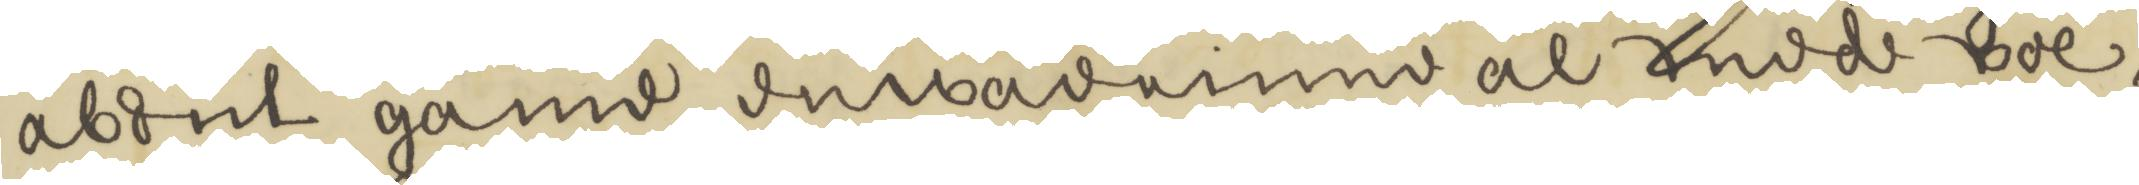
abdut ganie en waerinne al mede vol„
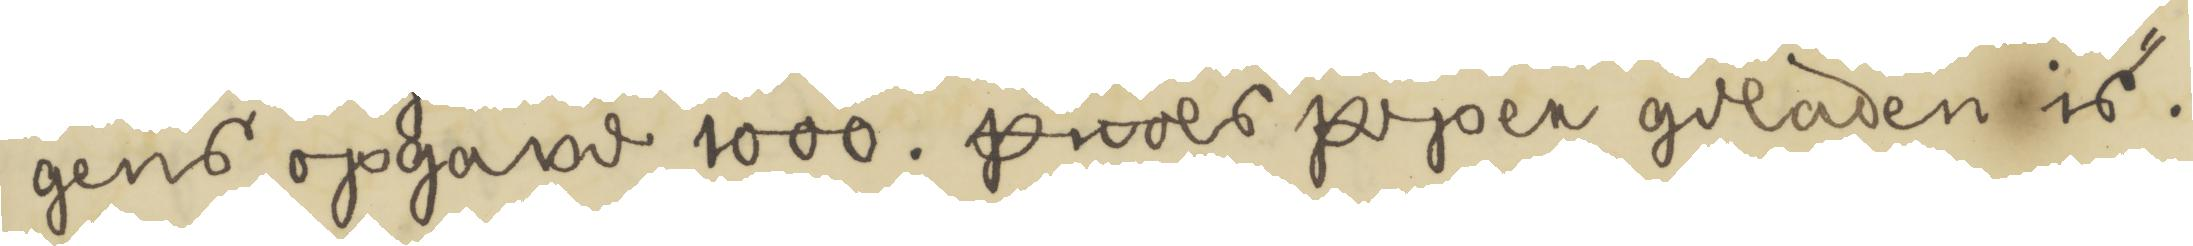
gens opgave 1000. picols peper geladen is.
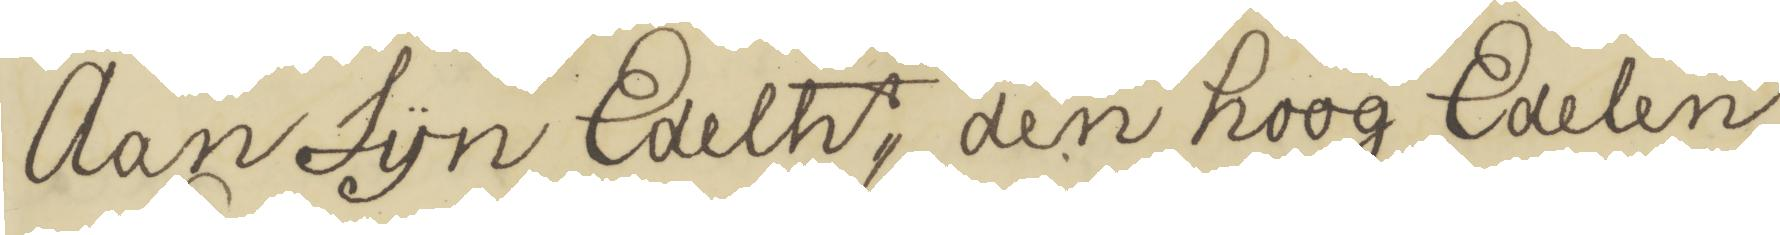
Aan sijn Edelh„t den hoog Edelen
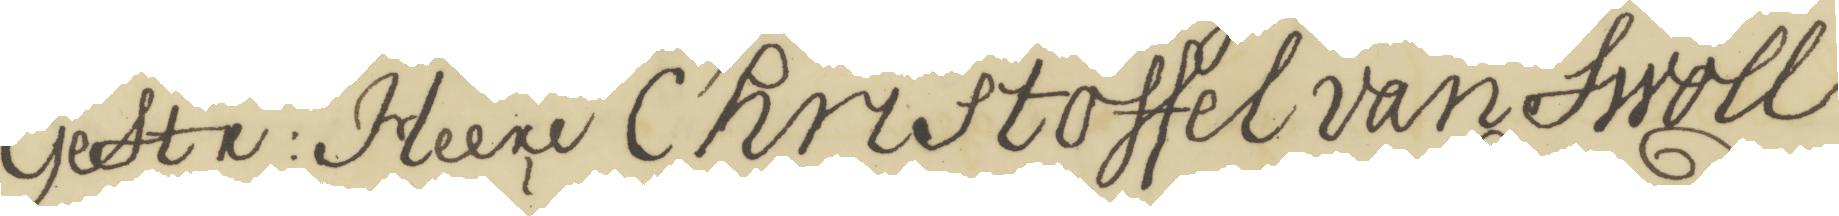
Gestr: Heere Christoffel van Swoll
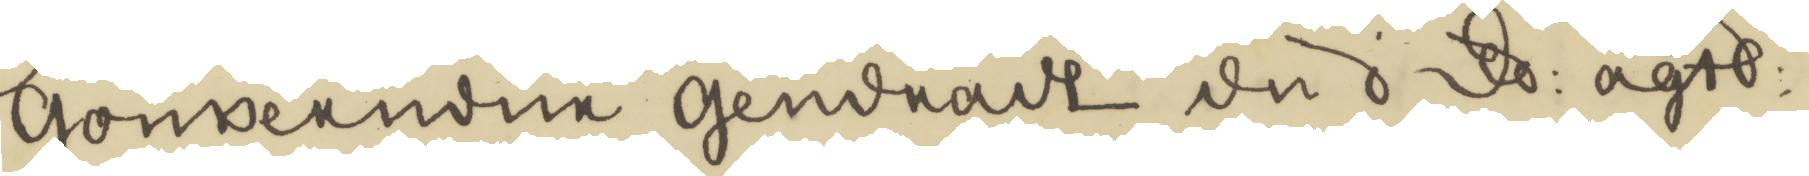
Gouverneur generael en d’ Ed: agtb:
